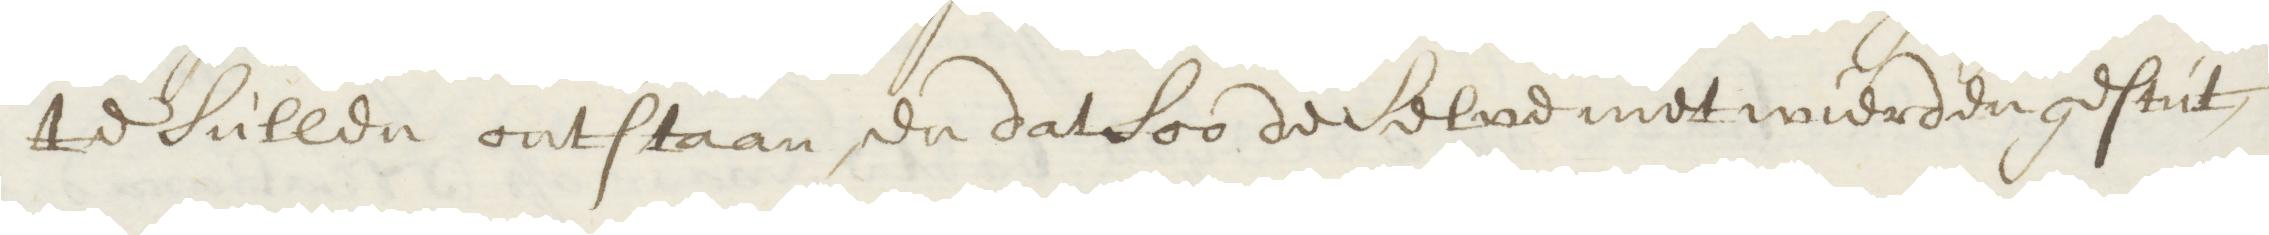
te sullen ontstaan, en dat Soo de selve niet wierden gestut,
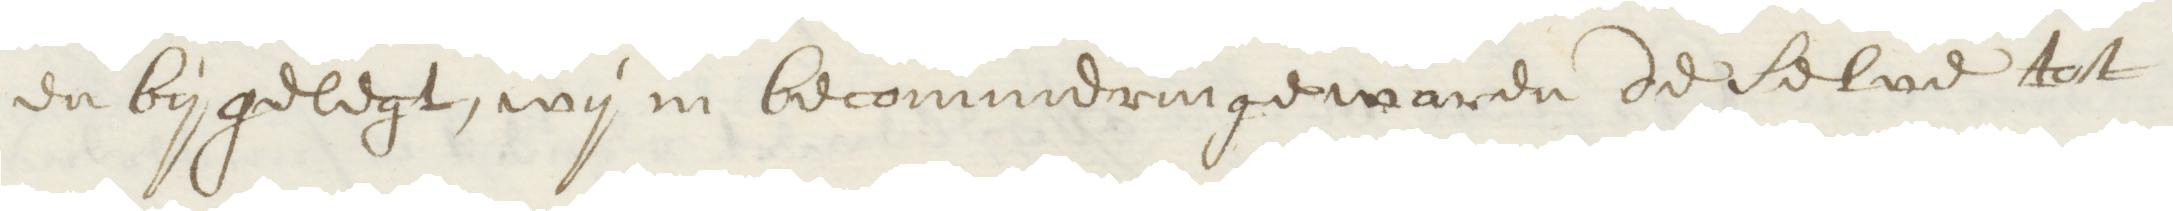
en bij gelegt, wij in becommeringe waren de selve tot
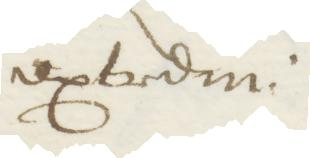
extrem:
